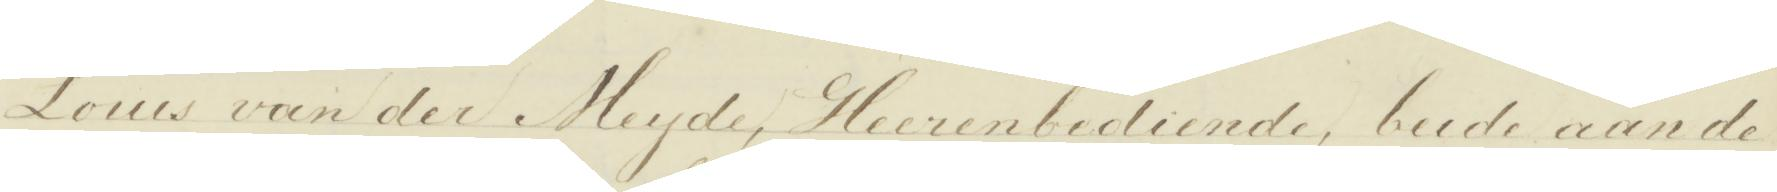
Louis van der Meyde, Heerenbediende, beide aan de
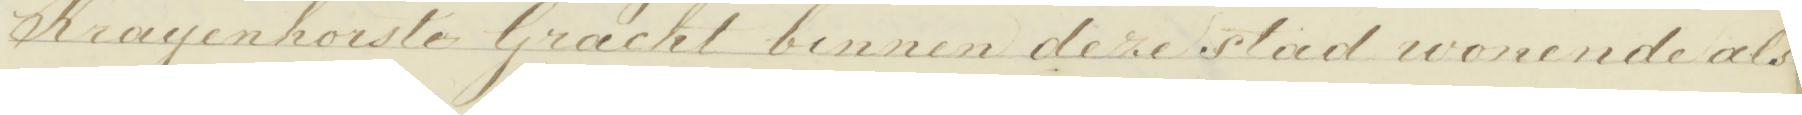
Krayenhorste Gracht binnen deze stad wonende als
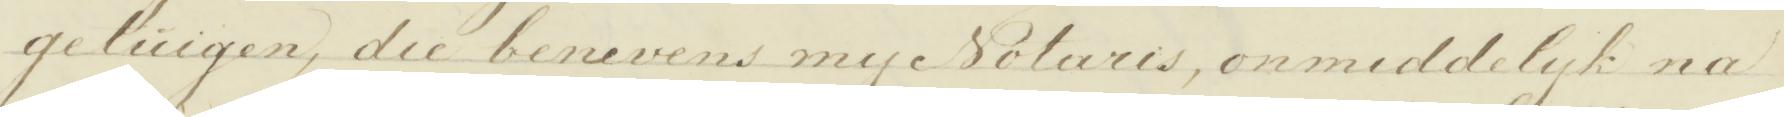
getuigen, die benevens my Notaris, onmiddelyk na
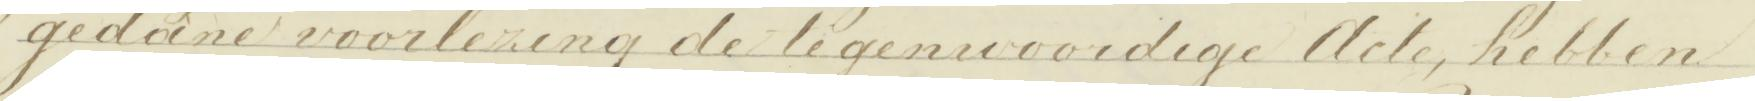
gedane voorlezing de tegenwoordige Acte, hebben
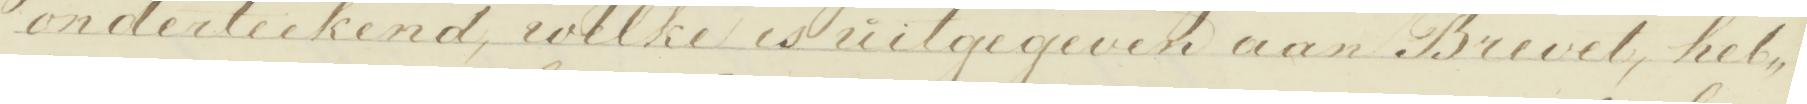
onderteekend, welke is uitgegeven aan Brevet, heb„
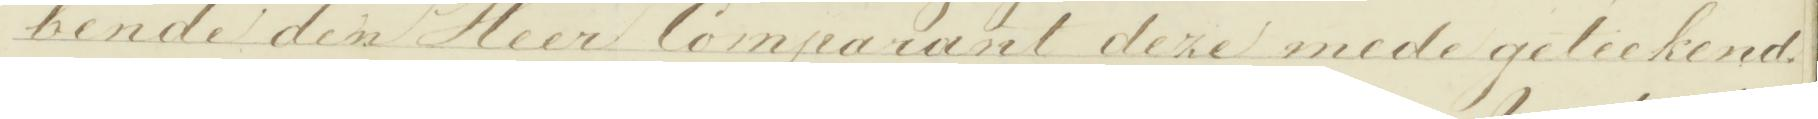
bende den Heer Comparant deze mede geteekend
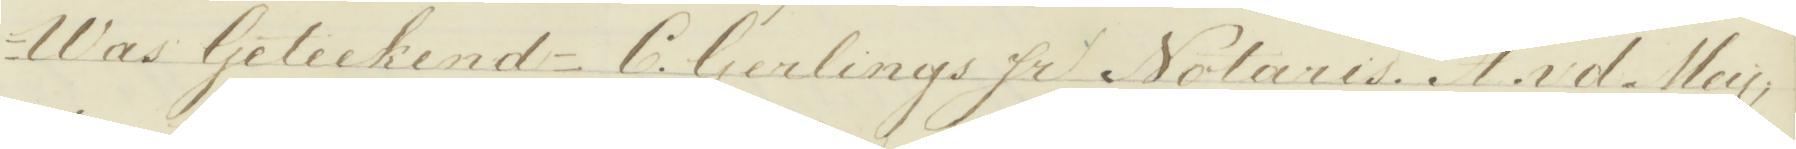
=Was Geteekend= C. Gerlings Jr Notaris. A. vd. Meij;
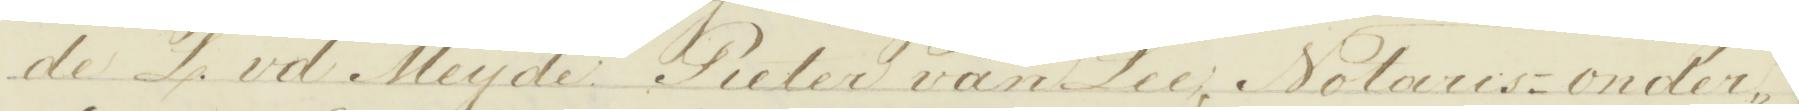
de L. vd. Meyde Pieter van Lee, Notaris =onder„
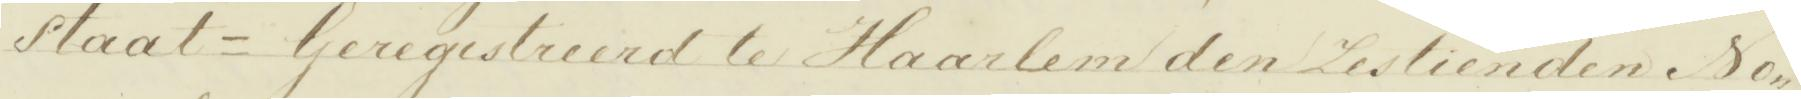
staat= Geregistreerd te Haarlem den Zestienden No„
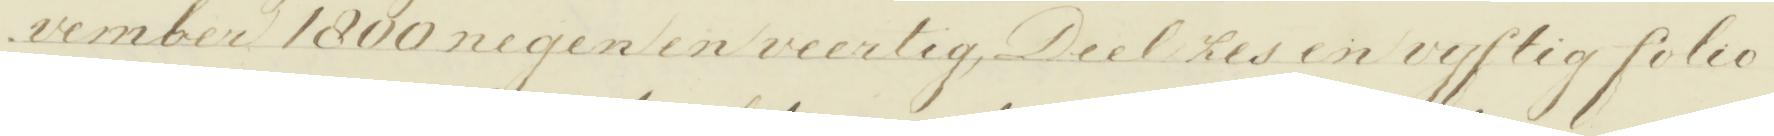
vember 1800 negen en veertig, Deel zes en vyftig folio
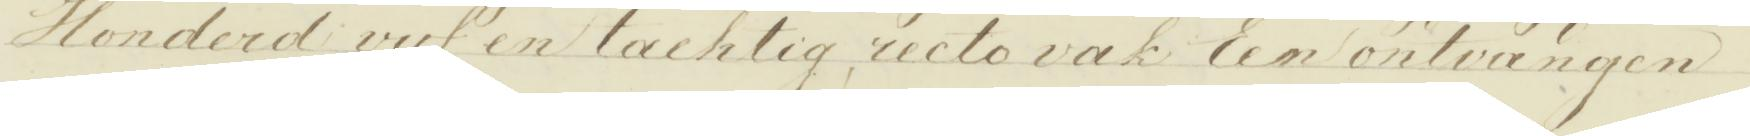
Honderd vyf en tachtig recto vak Een ontvangen
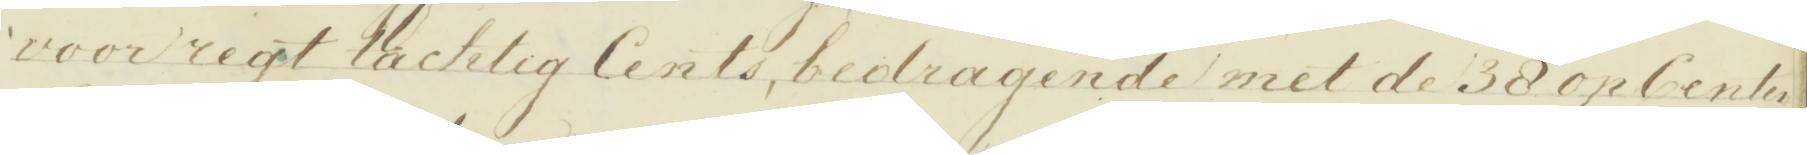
voor regt tachtig Cents, bedragende met de 38 op Centen
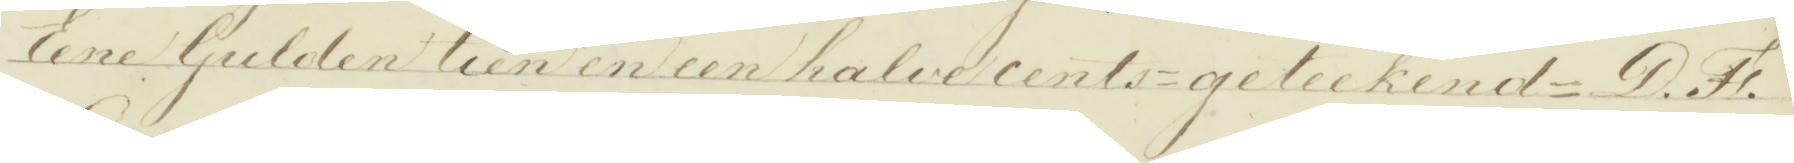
Eene Gulden tien en een halve cents =geteekend= D.F.
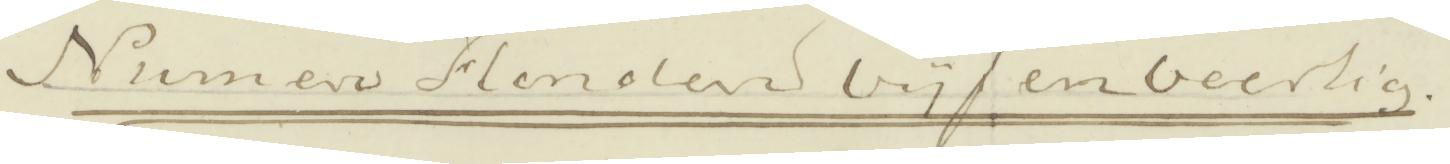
Numero Honderd vijf en veertig.
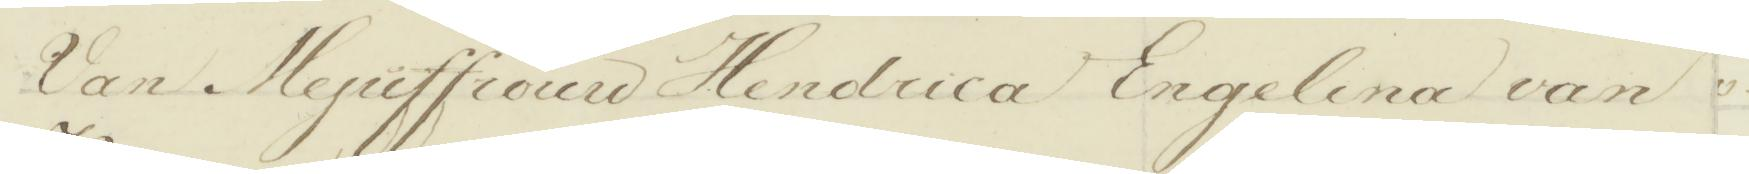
Van Mejuffrouw Hendrica Engelina van
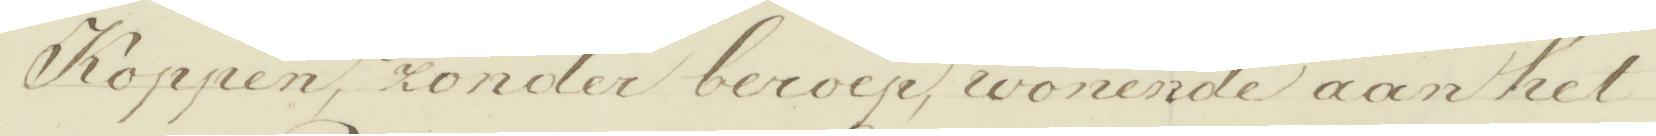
Koppen, zonder beroep, wonende aan het
